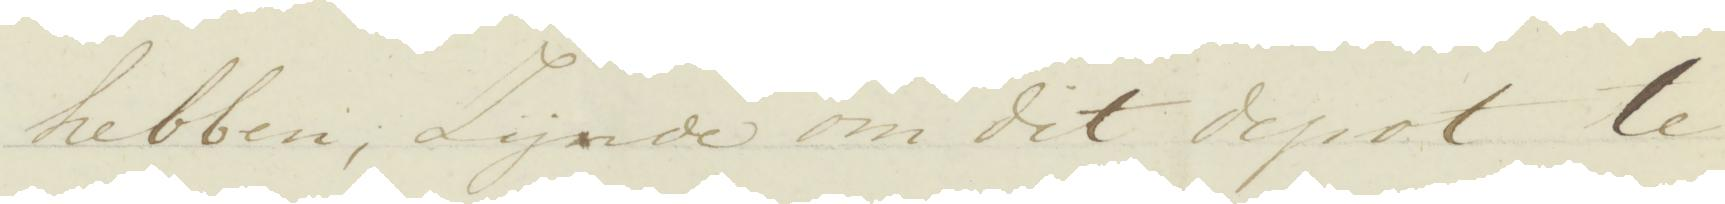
hebben; zijnde om dit depot te
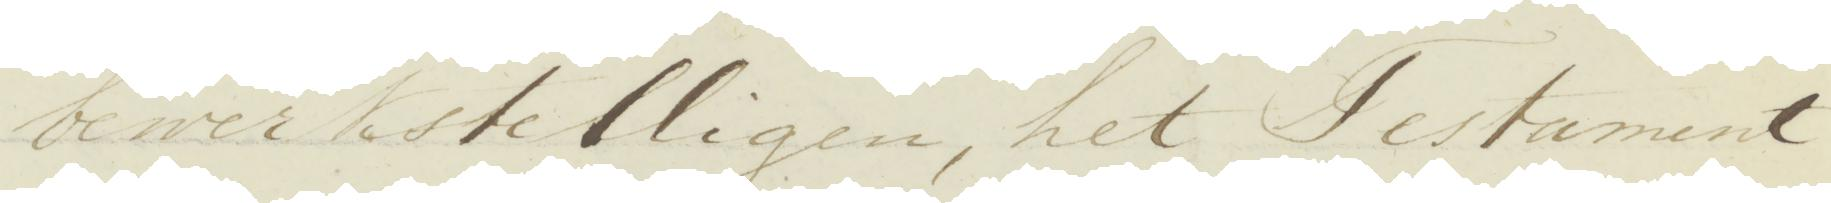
bewerkstelligen, het Testament
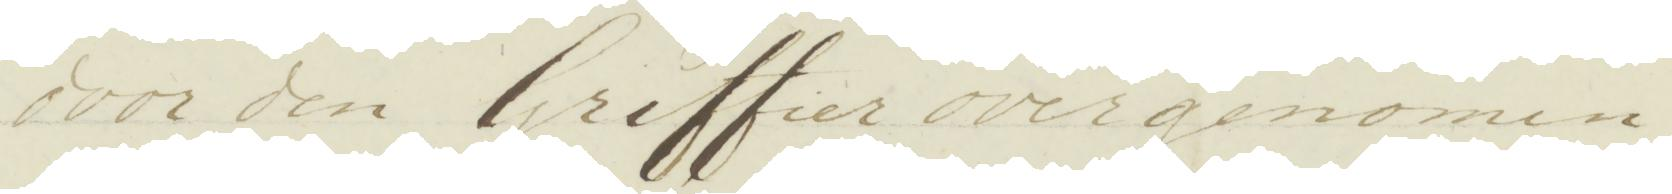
door den Griffier overgenomen
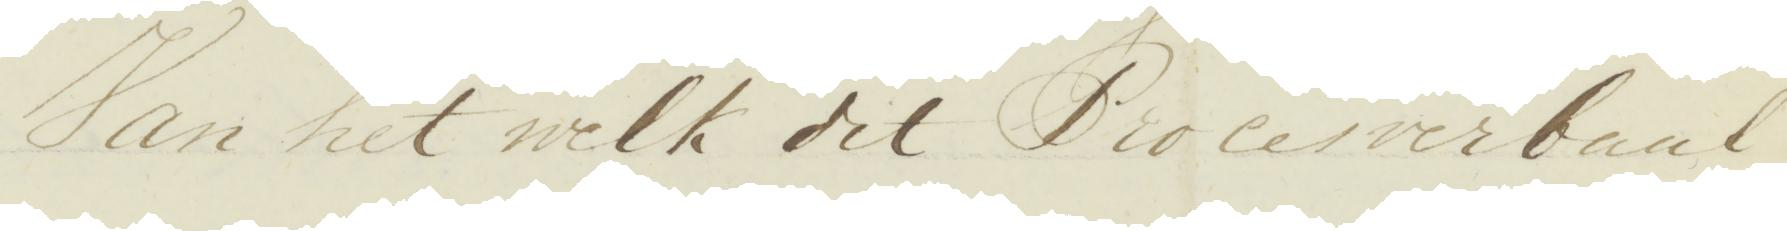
Van het welk dit Procesverbaal
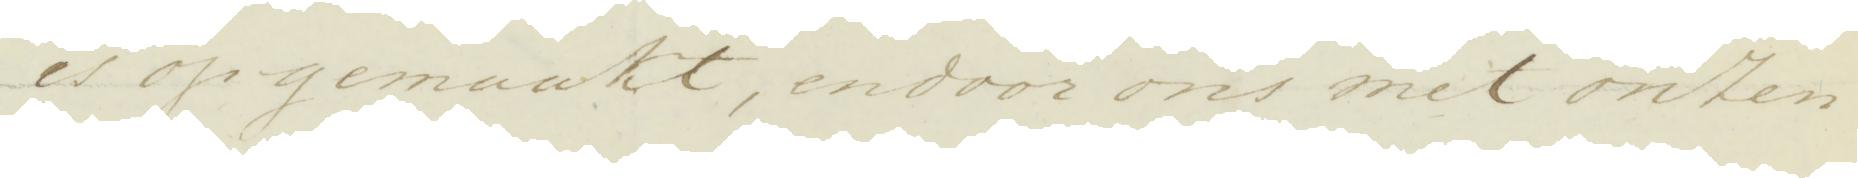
is opgemaakt, en door ons met onzen
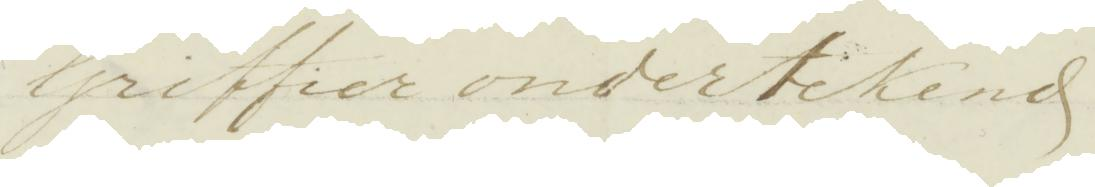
Griffier ondertekend
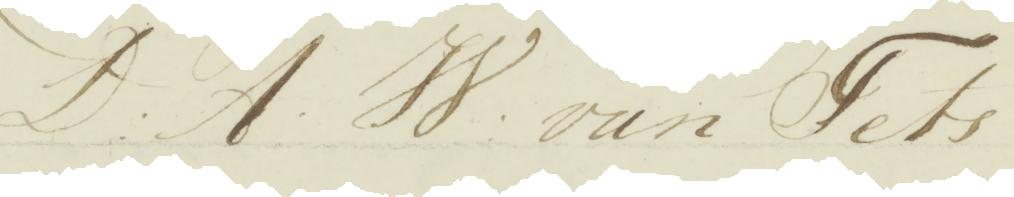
D: A: W: van Tets
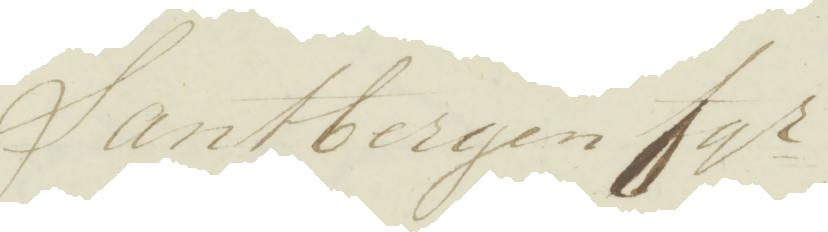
Santbergen fq-r
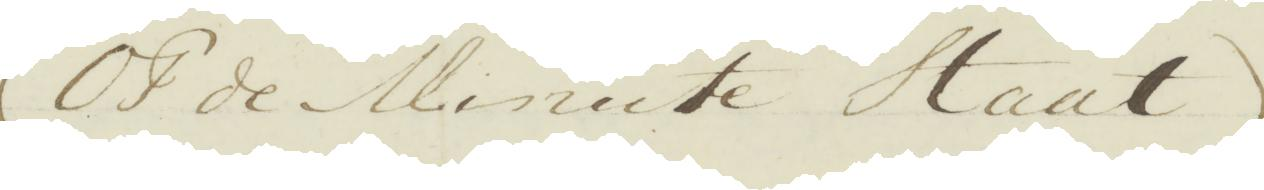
Op de Minute staat
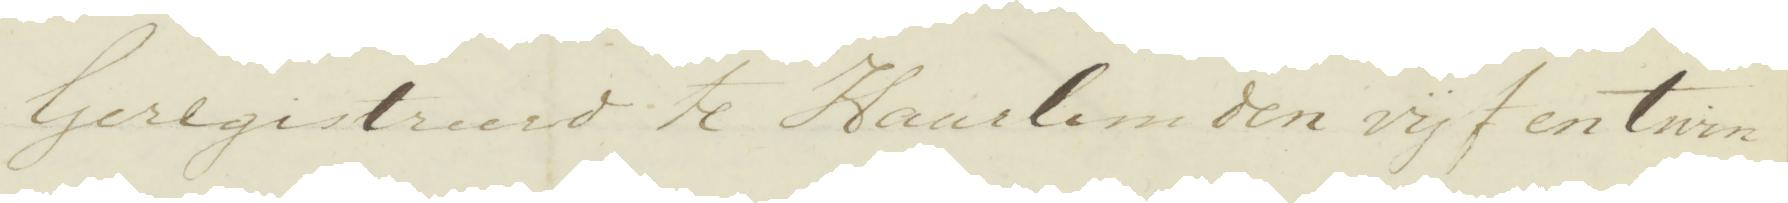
Geregistreerd te Haarlem den vijf en twin
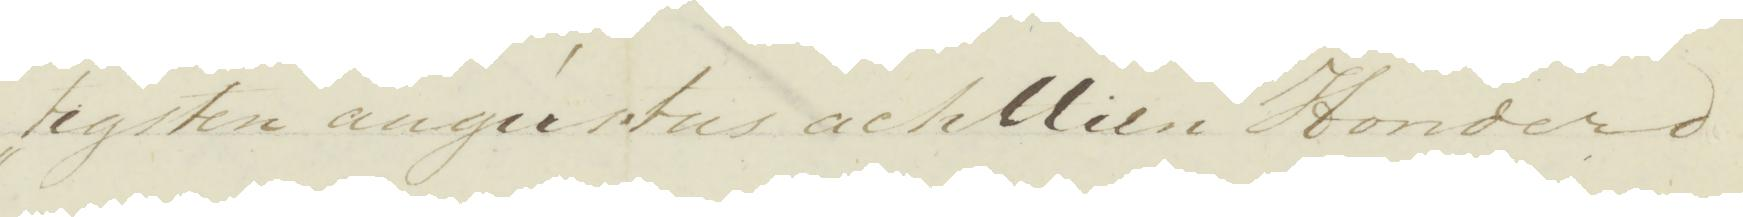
„tigsten augustus achttien Honderd
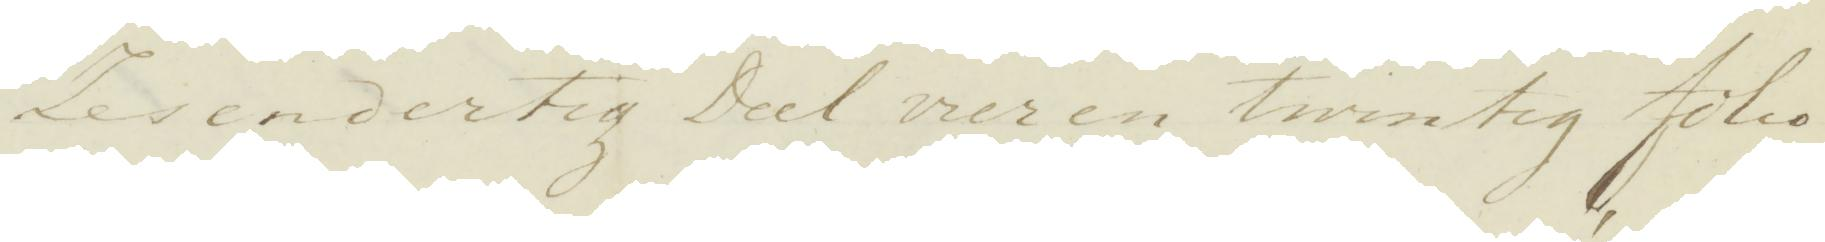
Zes en dertig Deel vier en twintig folio
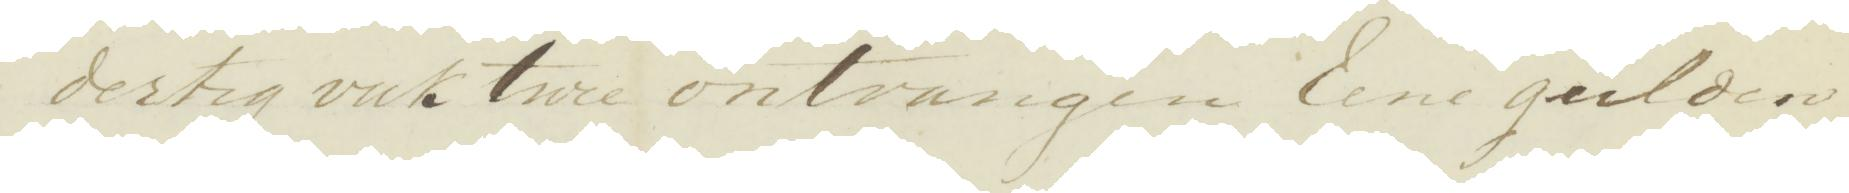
dertig vak twee ontvangen Eene gulden
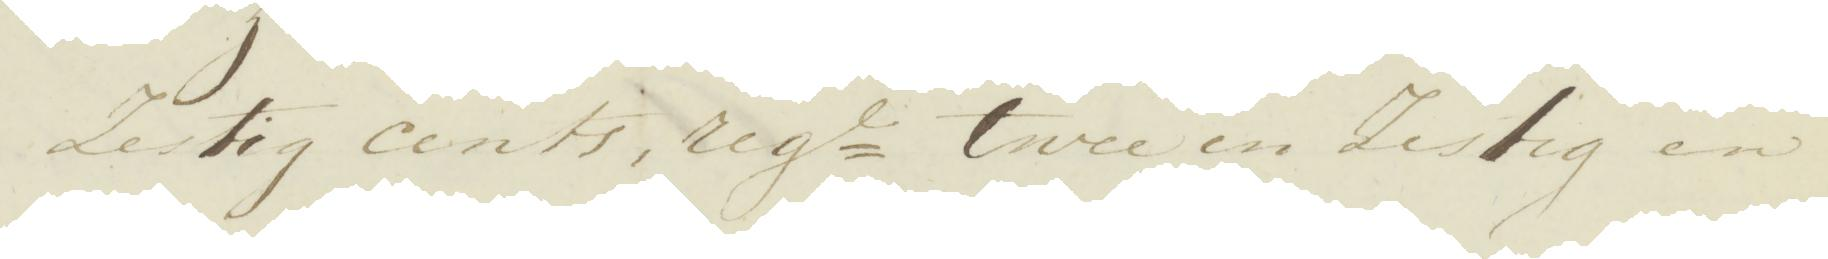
Zestig cents, reg=l twee en Zestig en
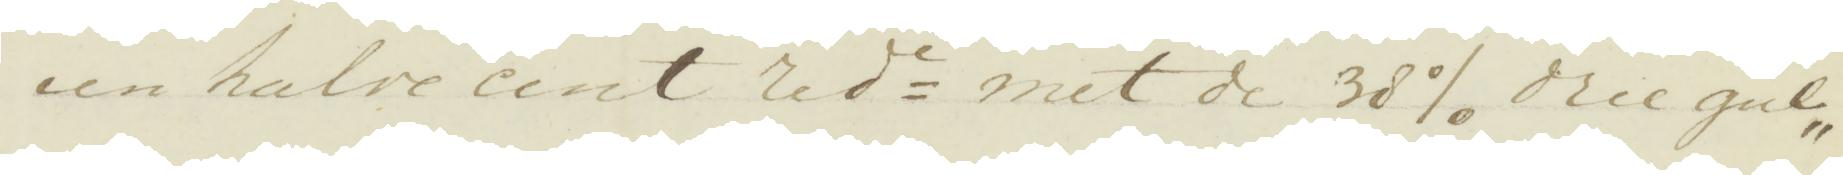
een halve cent red=e met de 38% drie gul„
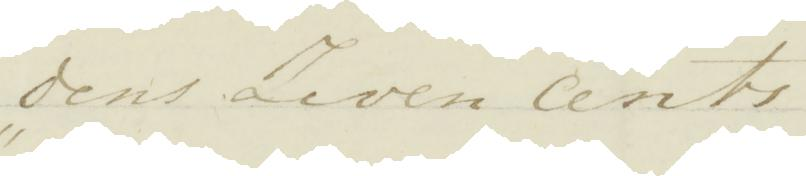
„dens Zeven cents
